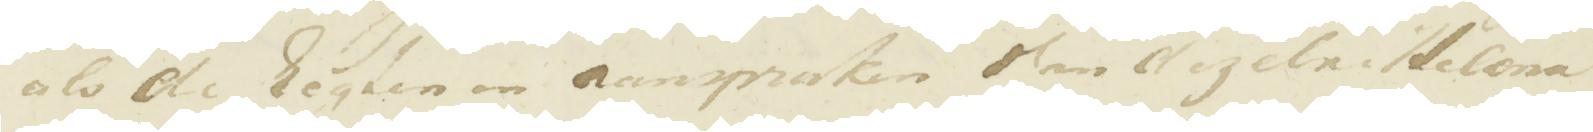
als de regten en aanspraken van dezelve Helena
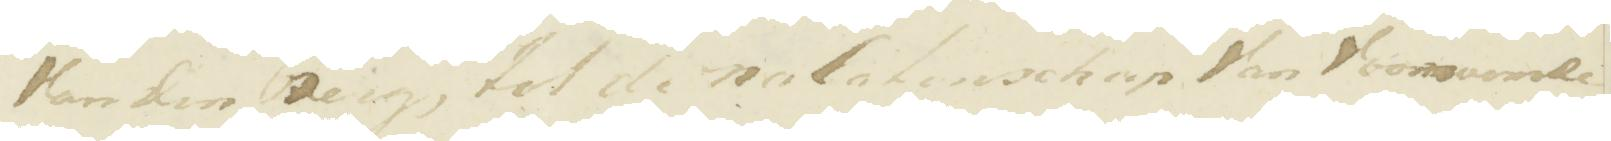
van den Berg, tot de nalatenschap van voornoemde
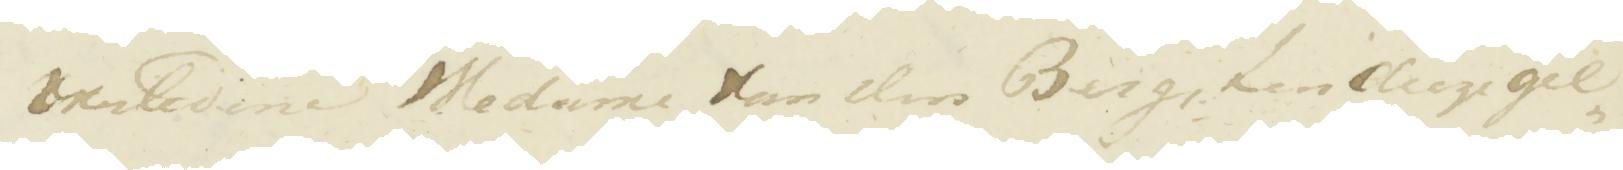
Overledene Weduwe van den Berg, ten deeze gel„
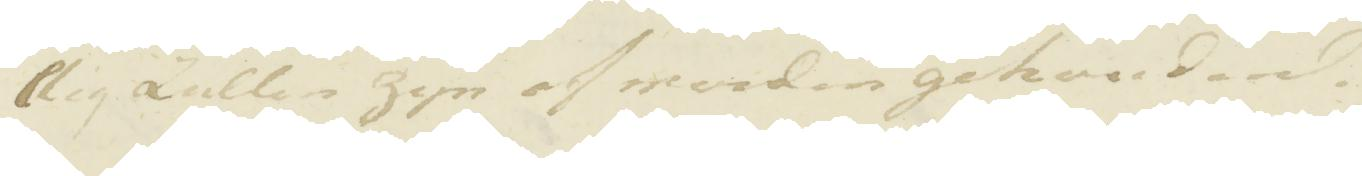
dig zullen zyn of worden gehouden.
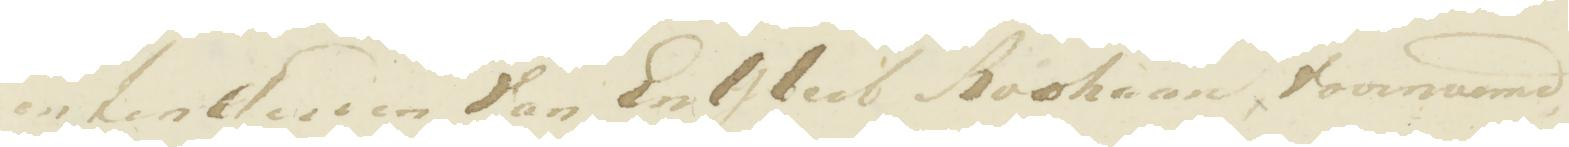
en ten derden van Engbert Roohaan, voornoemd,
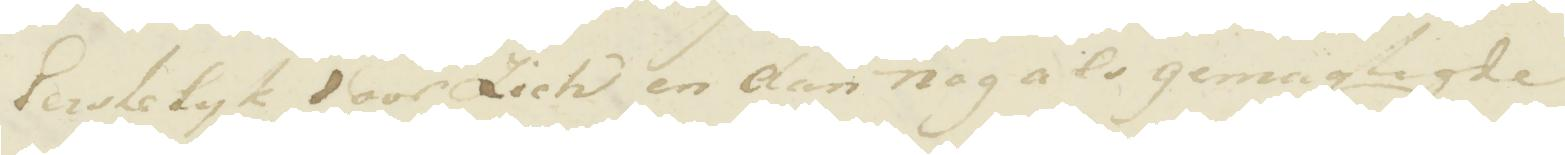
Eerstelyk voor zich en dan nog als gemagtigde
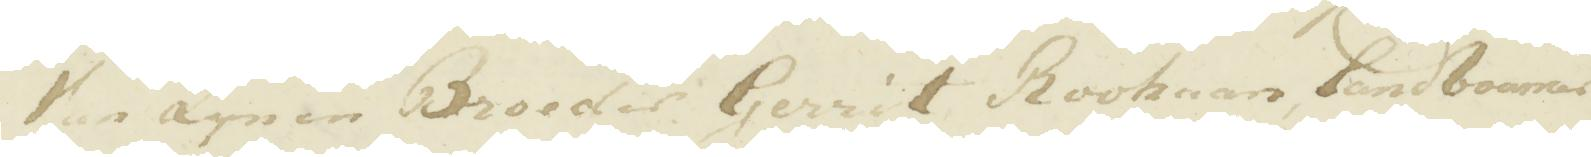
van zynen Broeder Gerrit Roohaan, landbouwer
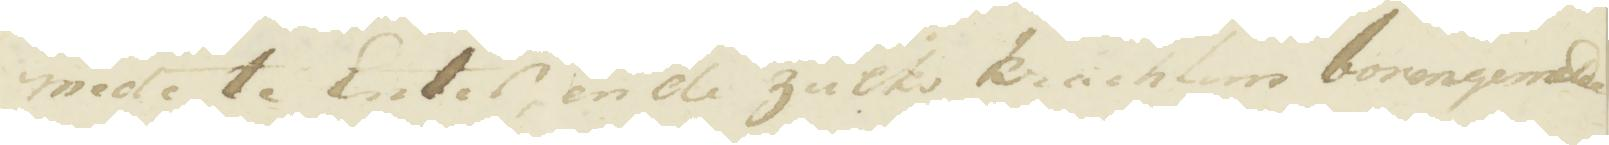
mede te Enter, en de zulks krachtens bovengemelde
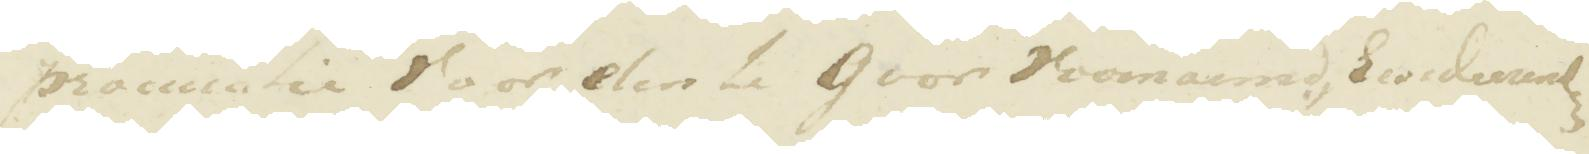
procuratie voor den te Goor voornoemd, resideerende
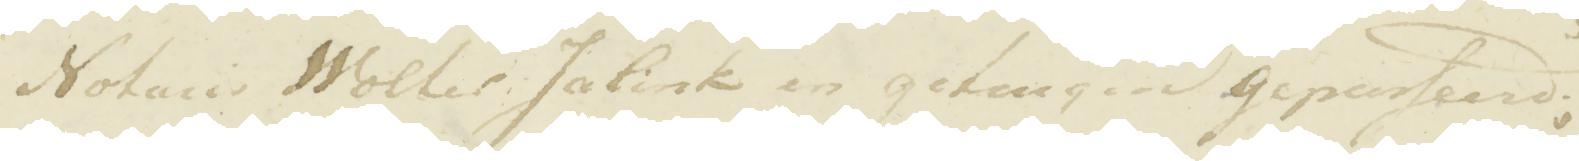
Notaris Wolter: Jalink en getuigen gepasseerd;
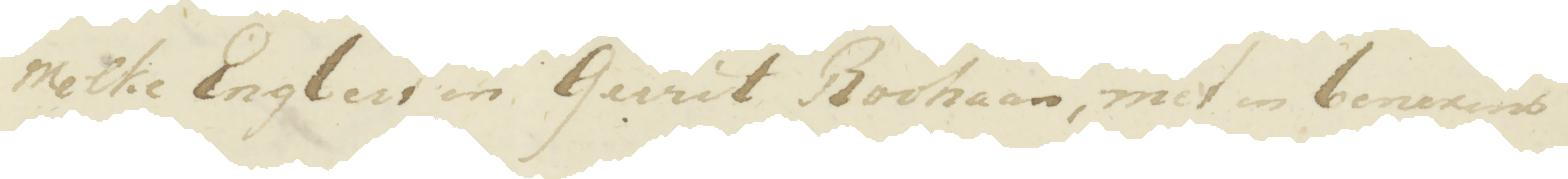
welke Engbert en Gerrit Roohaan, met en benevens
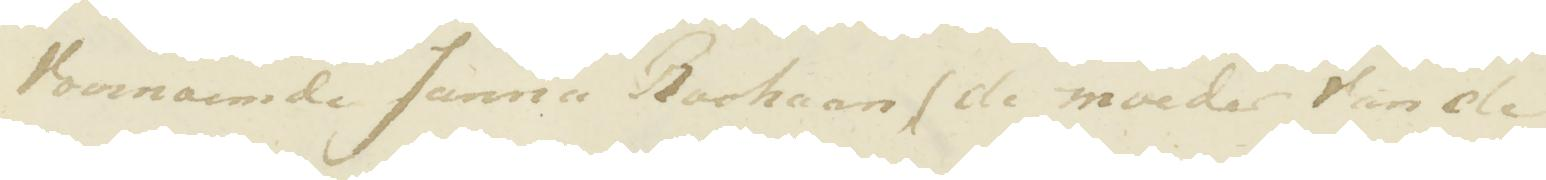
voornoemde Janna Roohaan, de moeder van de
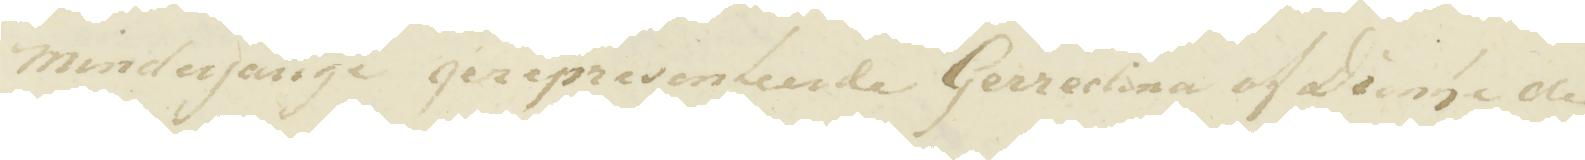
minderjarige gerepresenteerde Gerredina of Dienje de
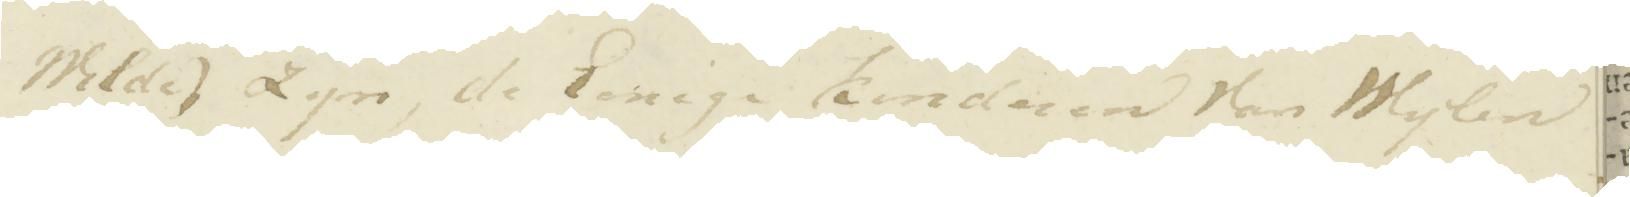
Wilde zyn, de Eenige kinderen van Wylen
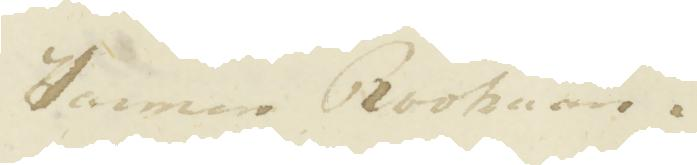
Harmen Roohaan.
